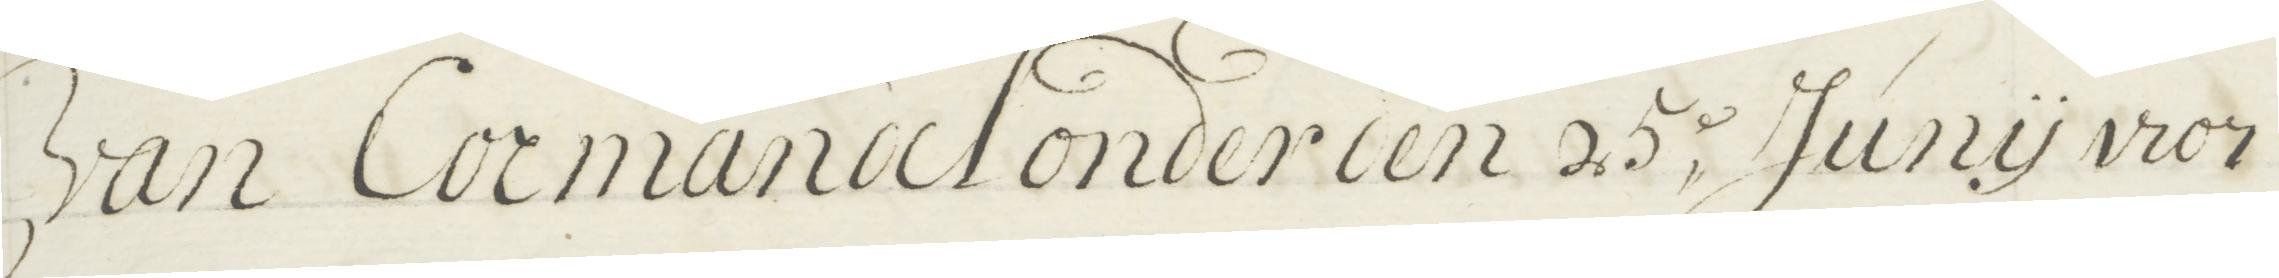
Van Cormandel onder den 25„e Junij 1707
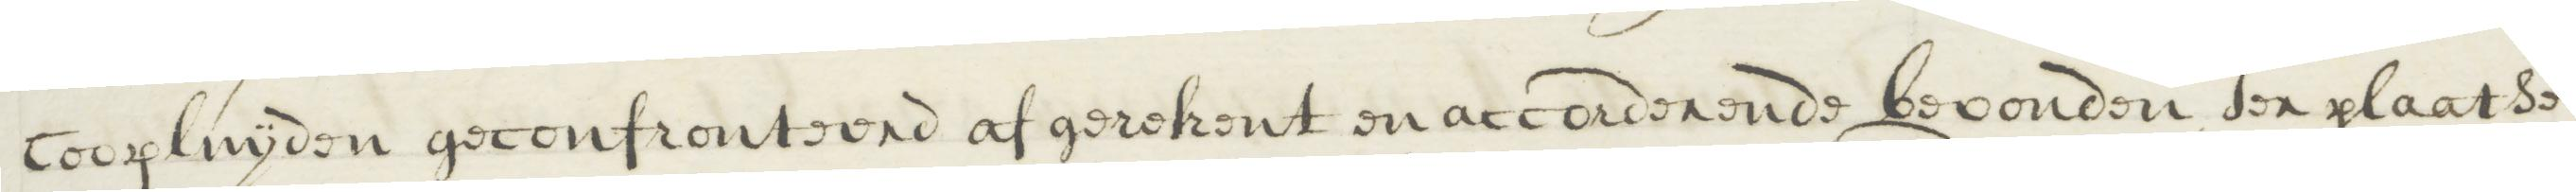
coopluijden geconfronteerd af gerekent en accorderende bevonden, ter plaatse
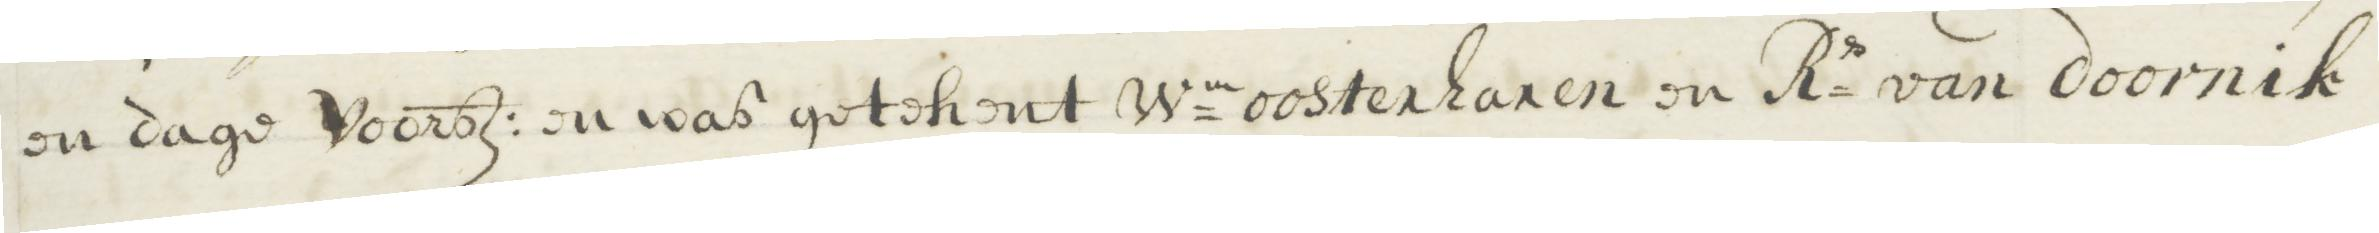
en dage voorsz: en was getekent W=m oosterharen en R=s van doornik
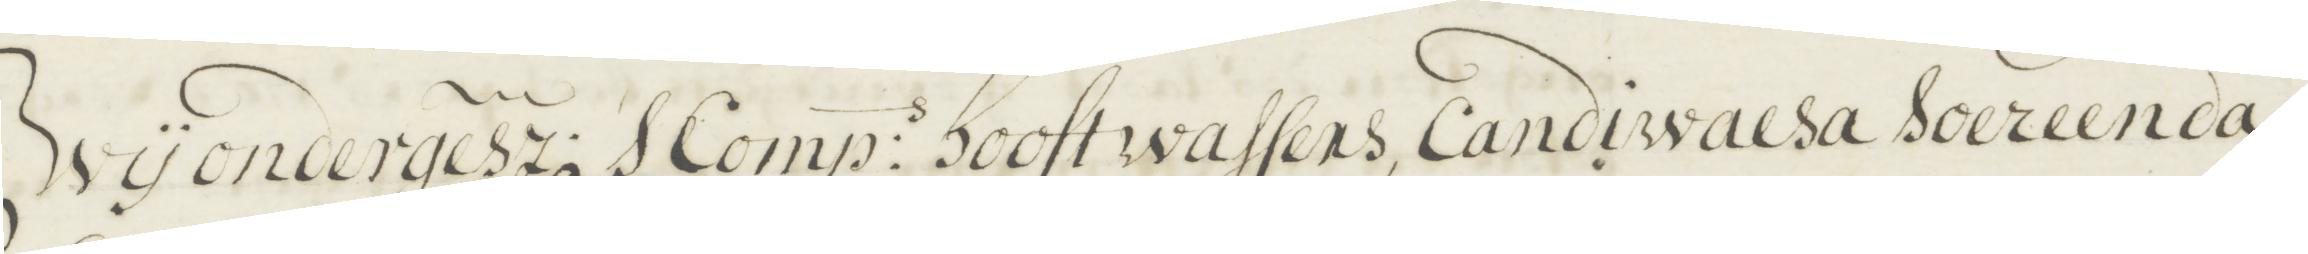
Wij ondergesz: ’s Comp:s hooftwassers, Candiwaesa soereenda
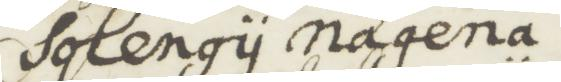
solengij nagena
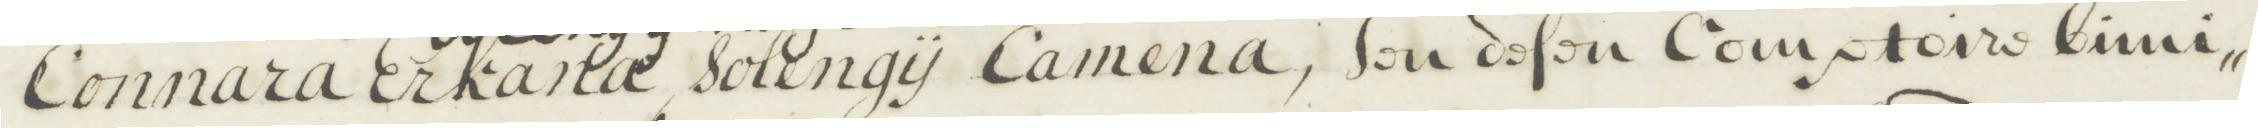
Connara Erkana ^ solengij Camena, ten desen Comptoire bimi„
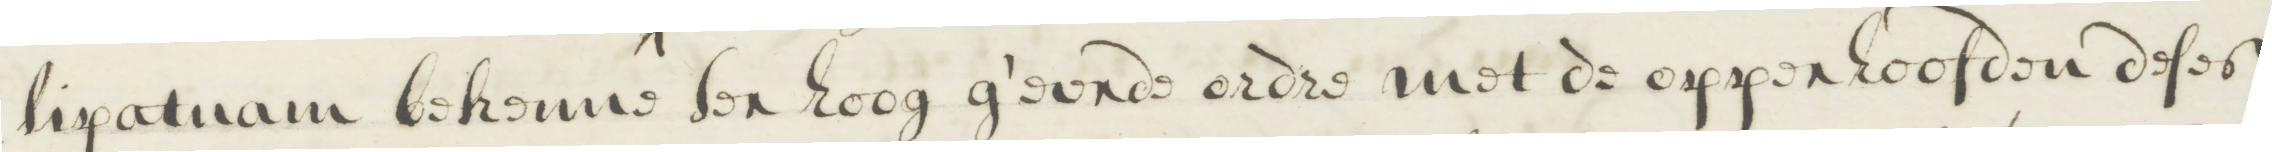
lipatnam bekenne ter hoog g’eerde ordre met de opperhoofden deses
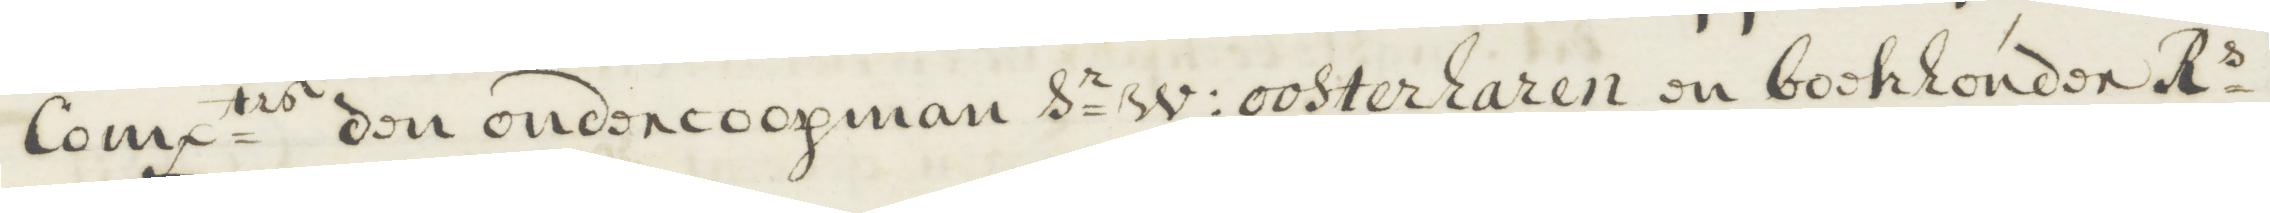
Comp=trs den ondercoopman S=r W: oosterharen en boekhouder R=s
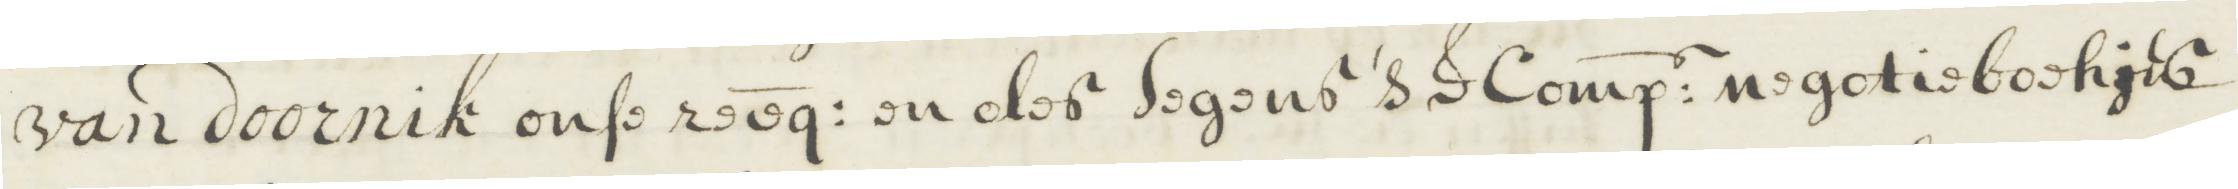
van doornik onse reeq: en des tegens ’s EComp:s negotie boekjes
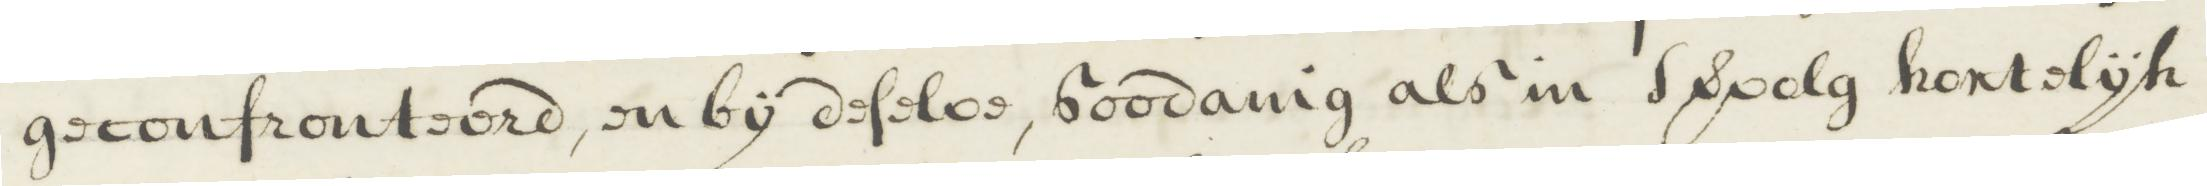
geconfronteerd, en bij deselve, soodanig als in t vervolg kortelijk
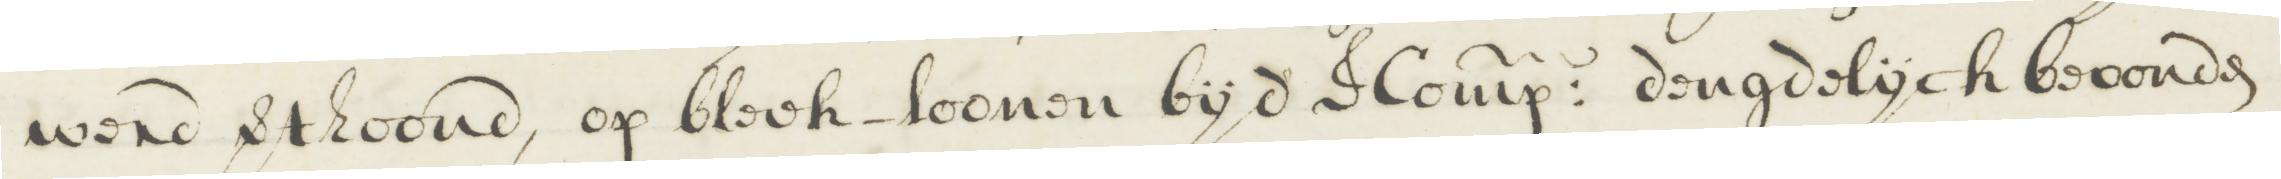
werd verthoond, op bleek-loonen bij d EComp: deugdelijck bevonden
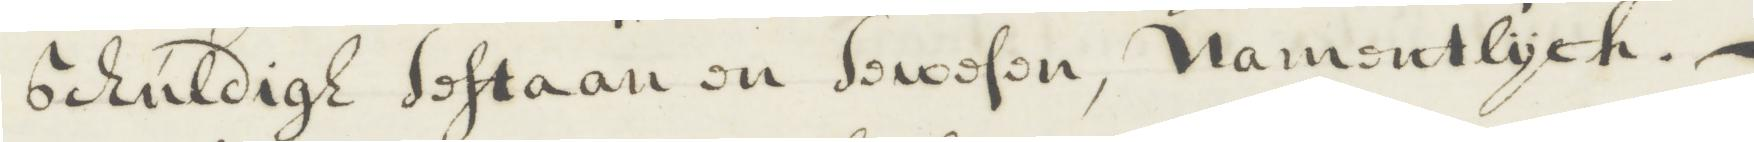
schuldigh testaan en tewesen, namentlijck.
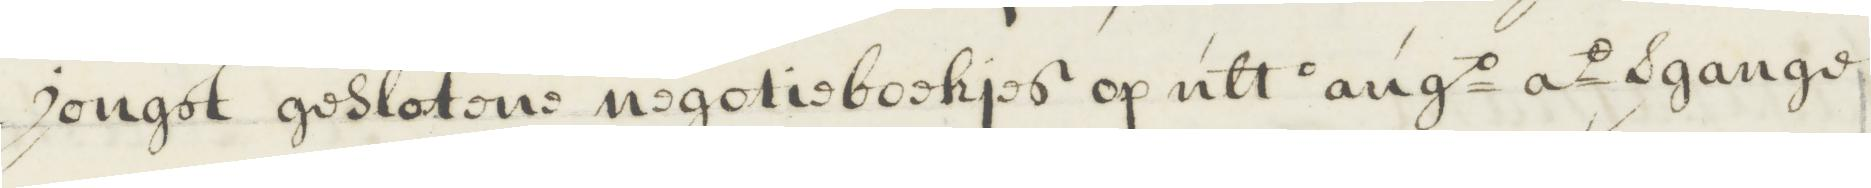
bij t slot der jongst geslotene negotieboekjes op ulto aug=o a=o vergange
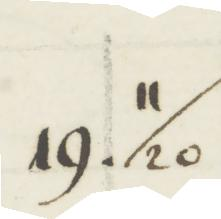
19. 11/20
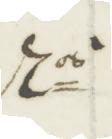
r=os
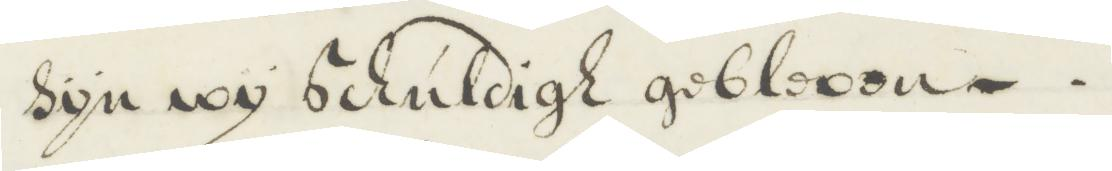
sijn wij schuldigh gebleven .
